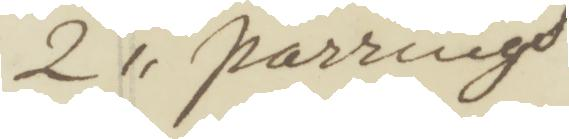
2 „ parrings
